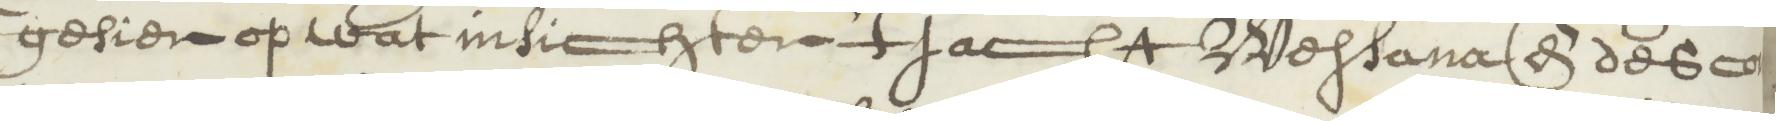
gesien op wat insichten 't jacht Wessana en desco
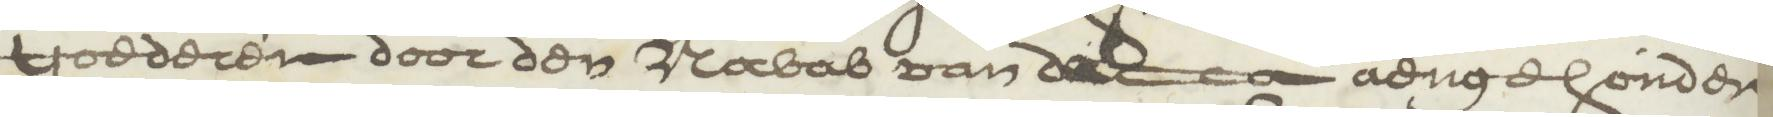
goederen door den Nabab van decca aengesonden
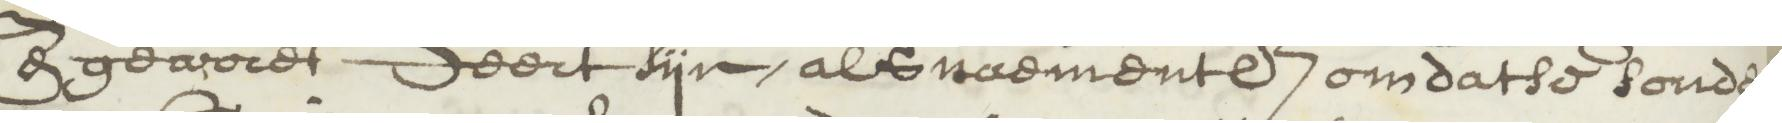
ende gearresteert sijn, als naementlijk om datse sonder
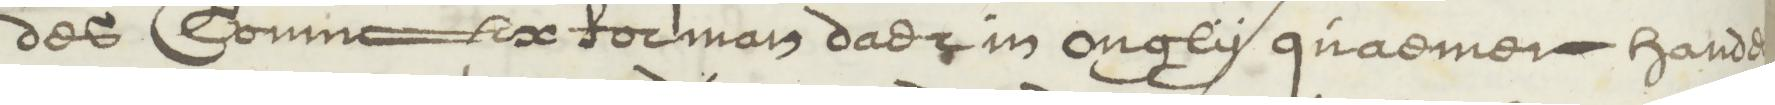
des Coninckx forman daer in onglij quaemen hande
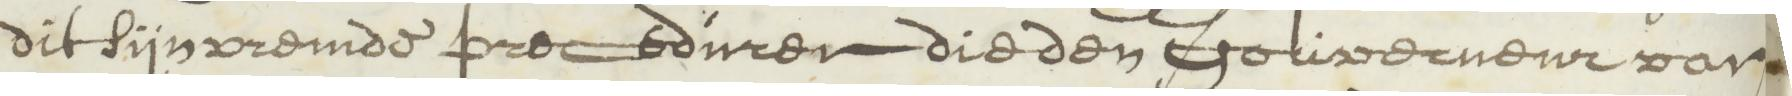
dit sijn vremde proceduren die den gouverneur van
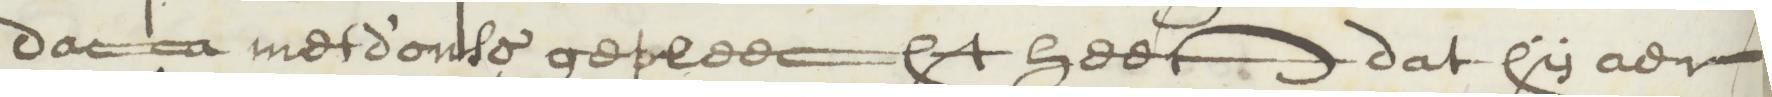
dacca met d'onse gepleecht heeft dat hij aen
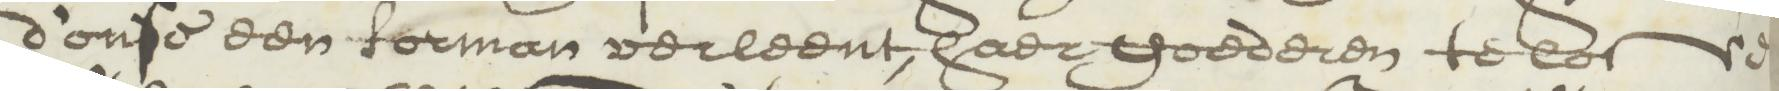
d’onse den forman verleent, haer goederen te laste
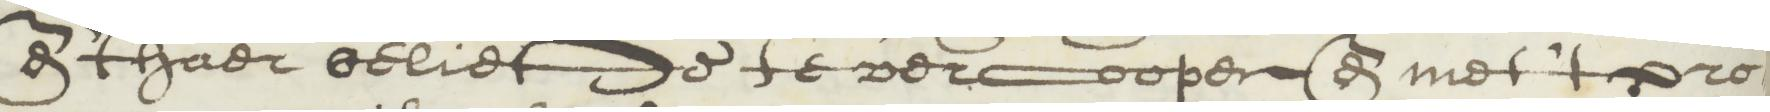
ende 't haer beliefte te vercoopen ende met ’t pro
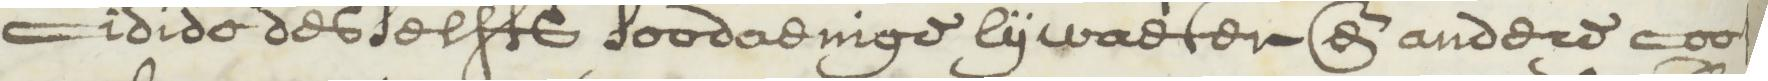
cidido desselffs soodaenige lijwaeten en andere coo
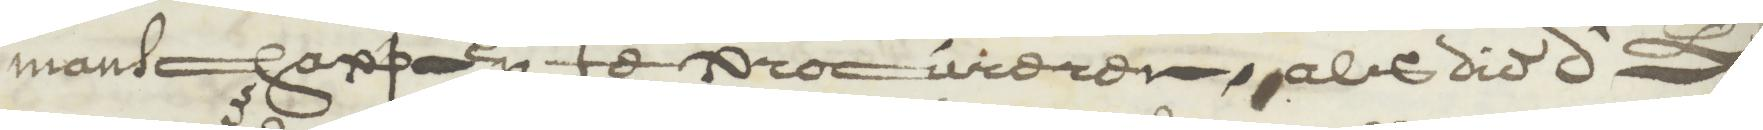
manschappen te procureren, als die d’ S
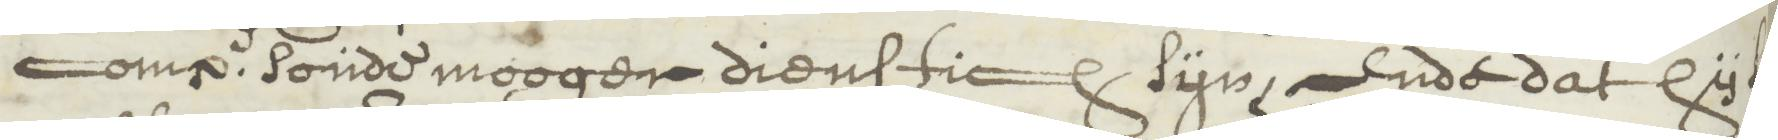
comp.e soude moogen dienstich sijn, ende dat hij
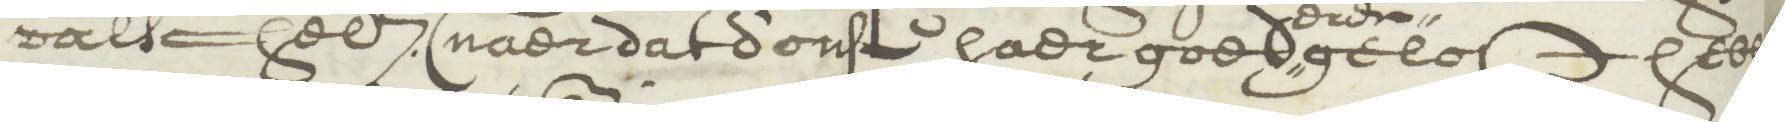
valschelijk, (naer dat d’onse haer goed„eren„ gelost hebb
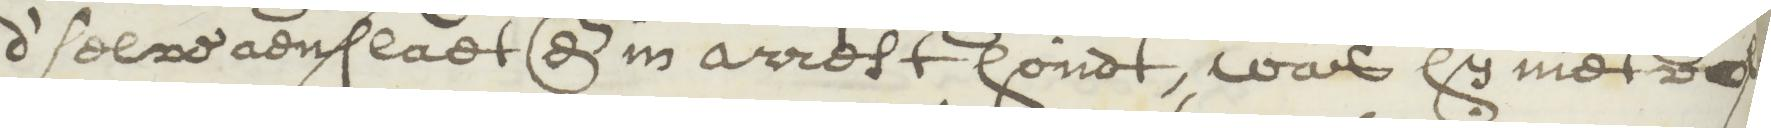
d’selve aenslaet ende in arrest houdt, was hij niet v
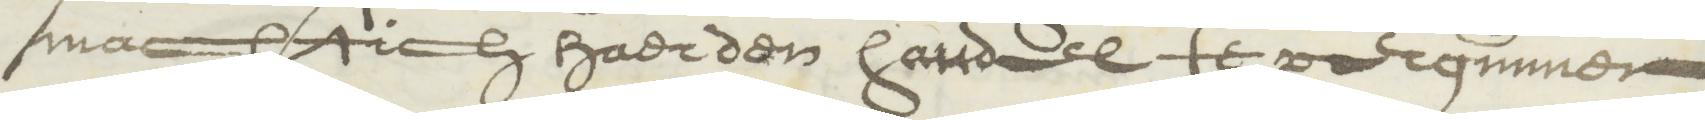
machtich haer den handel te vergunnen
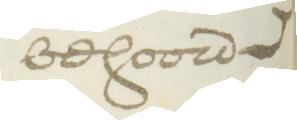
behoorde
